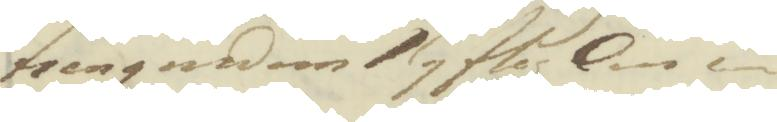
tien guldens Vyftig Cent
